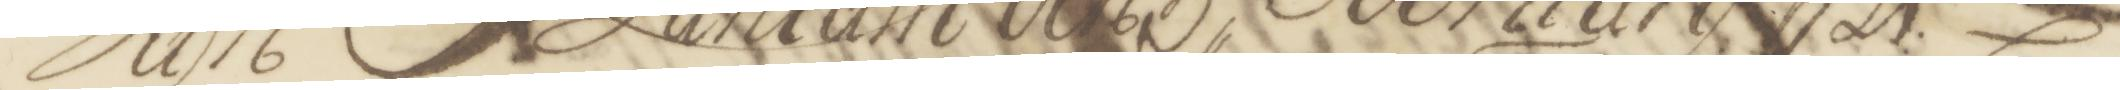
Van Bantam den 5„e Februarij 1721. —
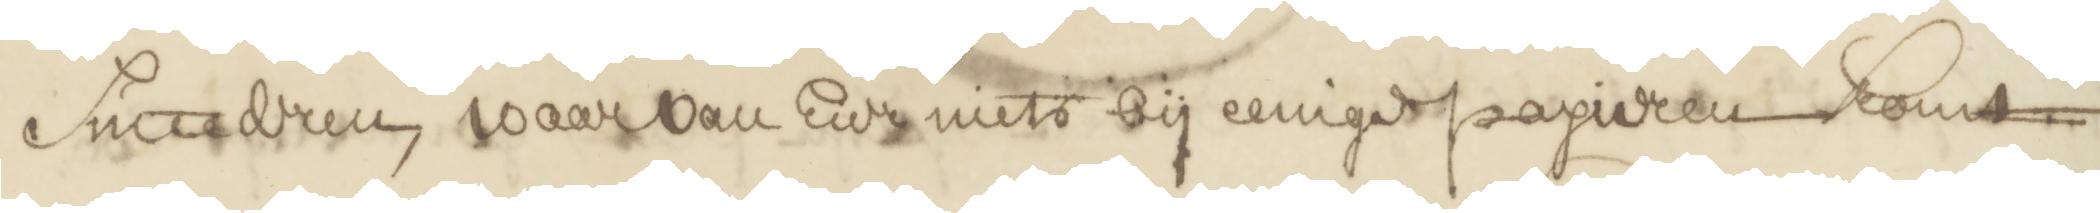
succederen waarvan hier niets bij eenige papieren komt
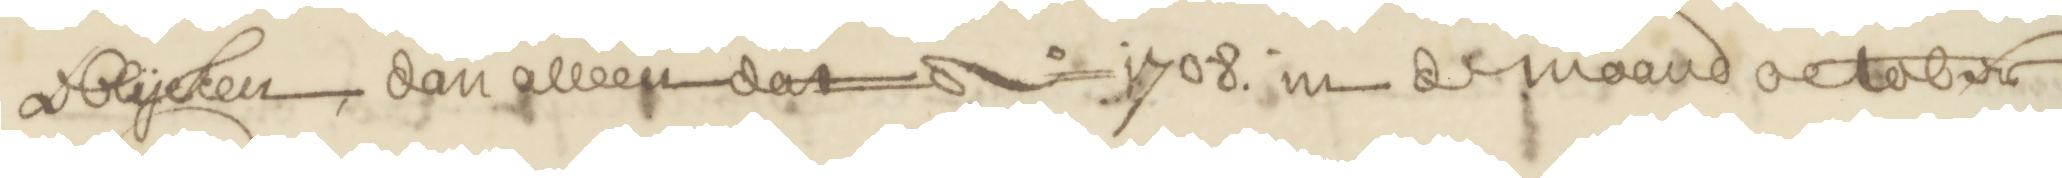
teblijcken, dan alleen dat A=o 1708. in de maand october
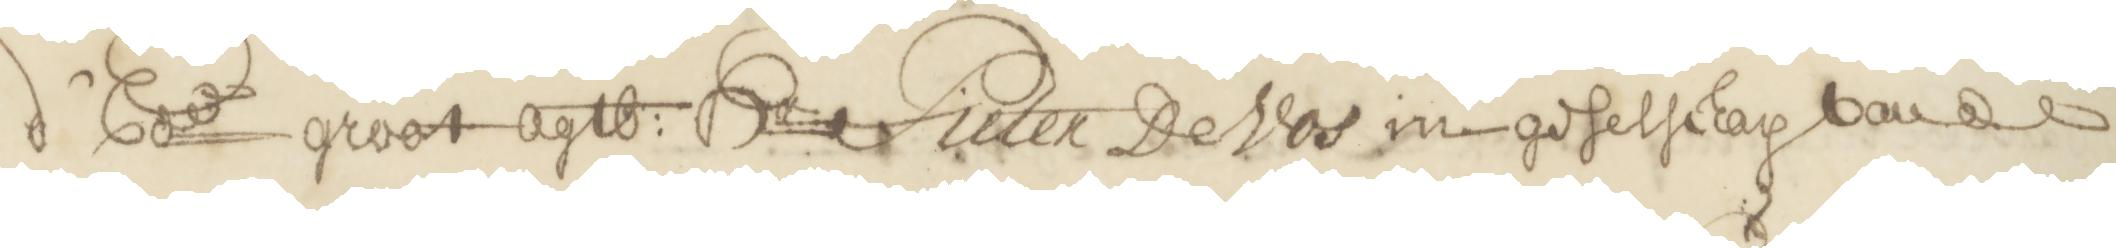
d’ Ed=e groot agtb: H=r Pieter De Vos in geselschap van de
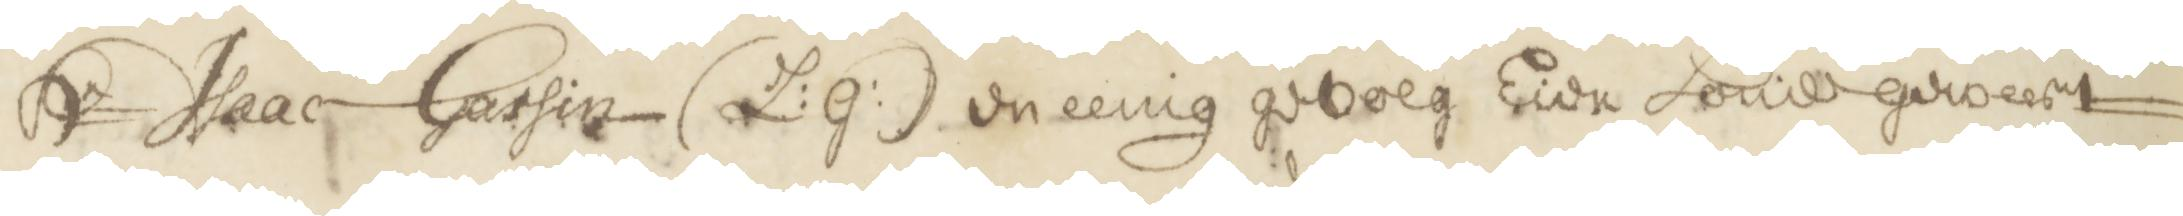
H=r Isaac Gassin (Z: G:) en eenig gevolg hier soude geweest
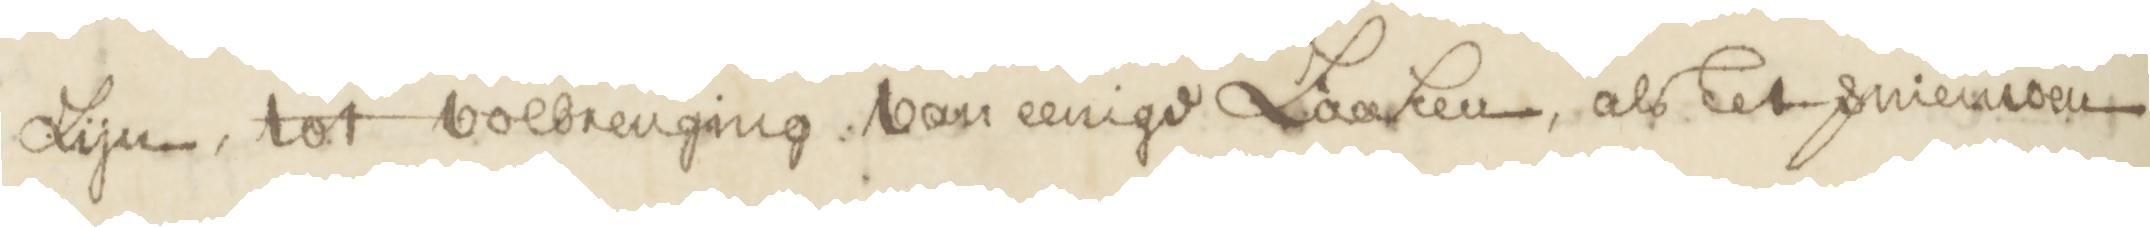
zijn, tot volbrenging van eenige Zaaken, als het vernieuwen
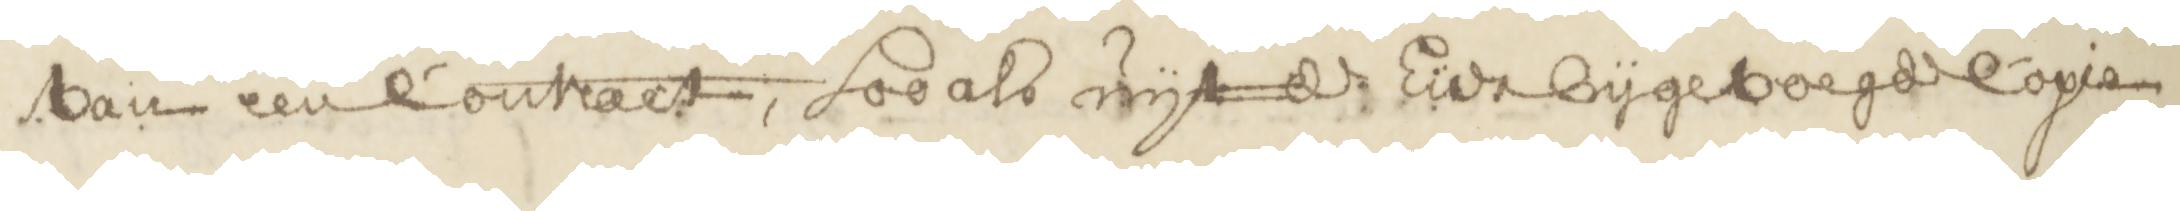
van een contract, soo als uijt de hier bij gevoegde copia
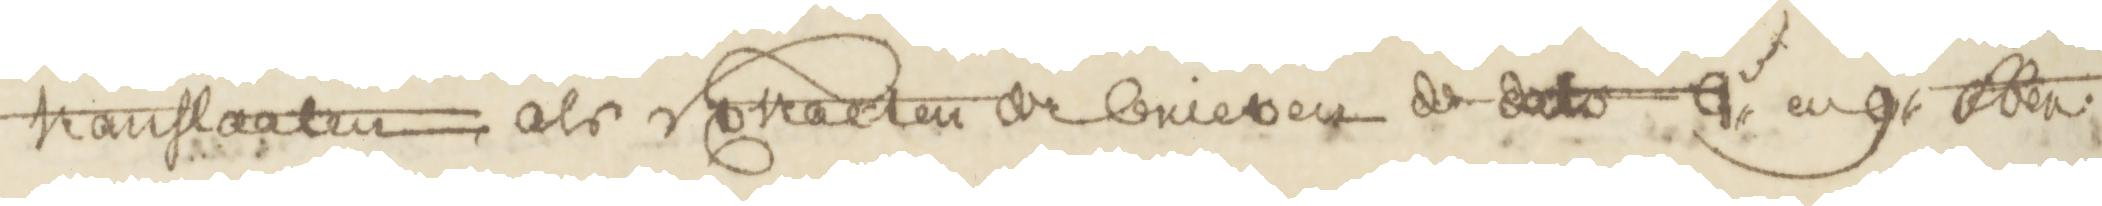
translaaten als Extracten der brieven de dato 4„e en 9„e 8ber:
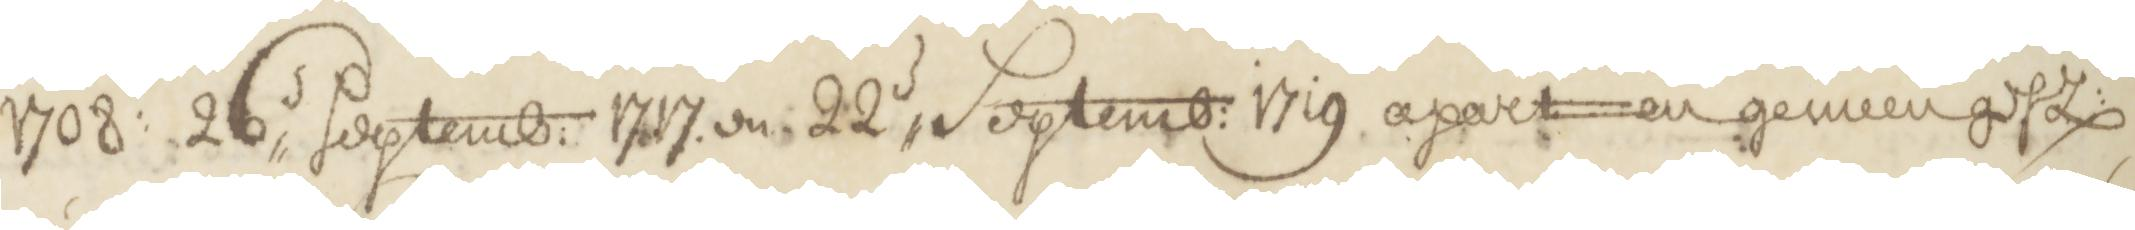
1708: 26„e septemb: 1717. en 22„e septemb: 1719 aparten gemeen gesz:,
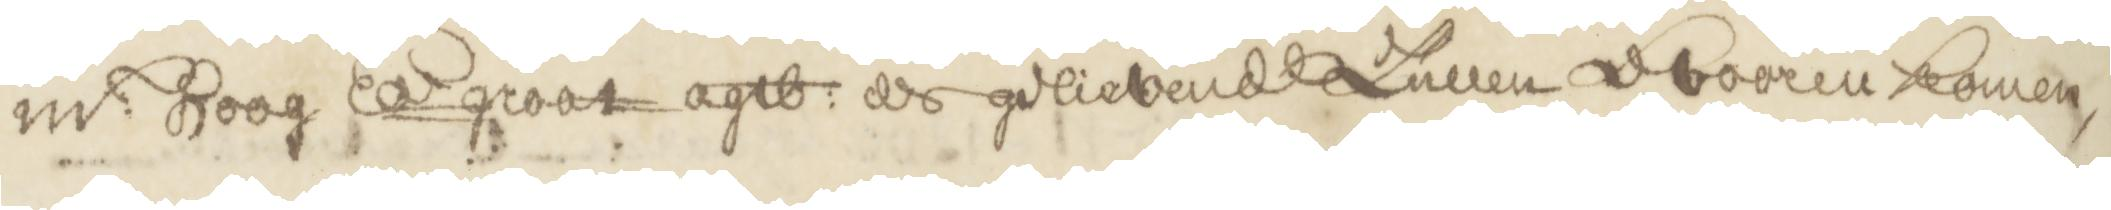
uE: hoog Ed=' groot agtb: desgelievende Zullen te vooren komen,
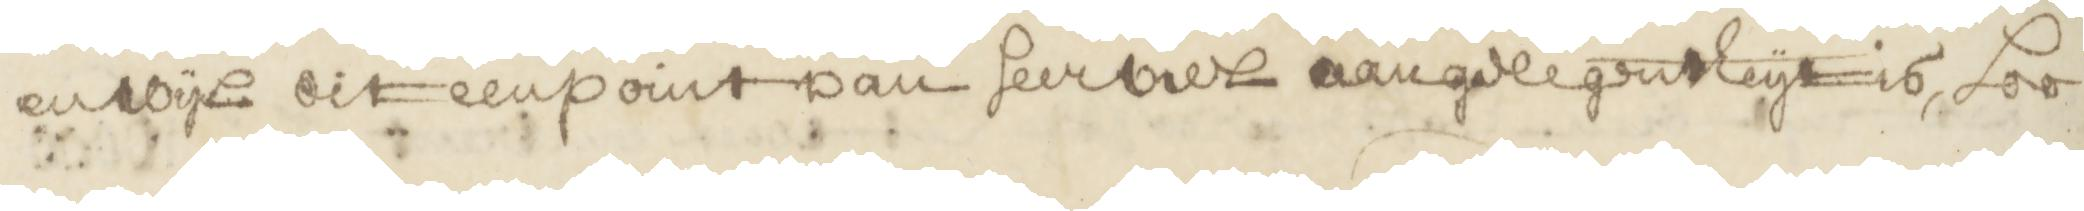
en wijl dit eenpoint van seerviel aangelegentheijt is, soo
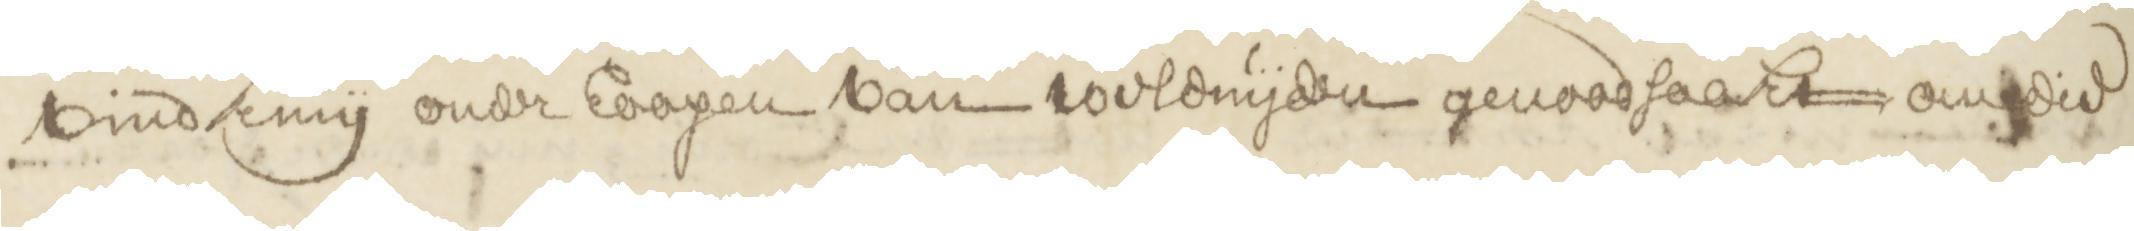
vind 'kmij onder hoopen van welduijden genoodsaakt, om die
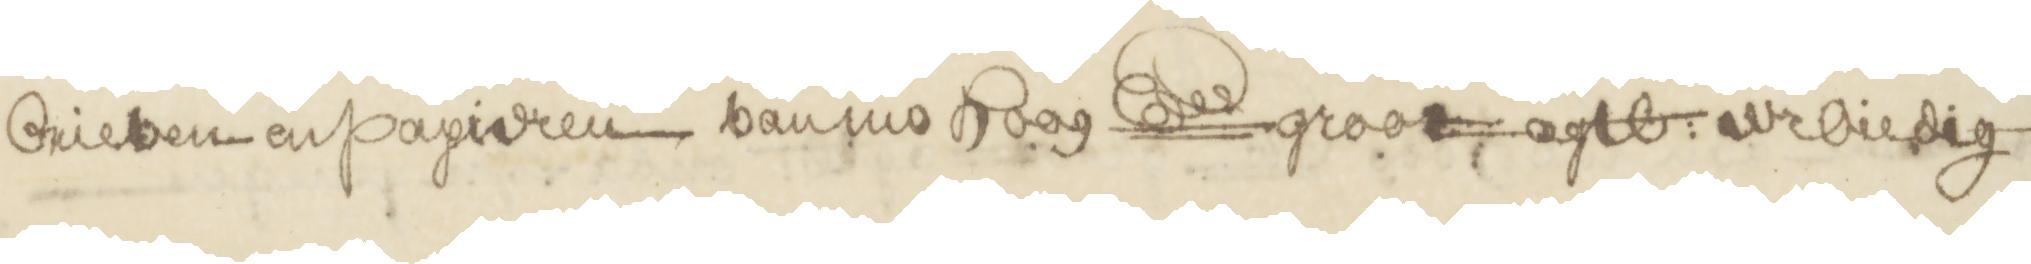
brieven en papieren van uw Hoog Ed=es groot agtb: eerbiedig
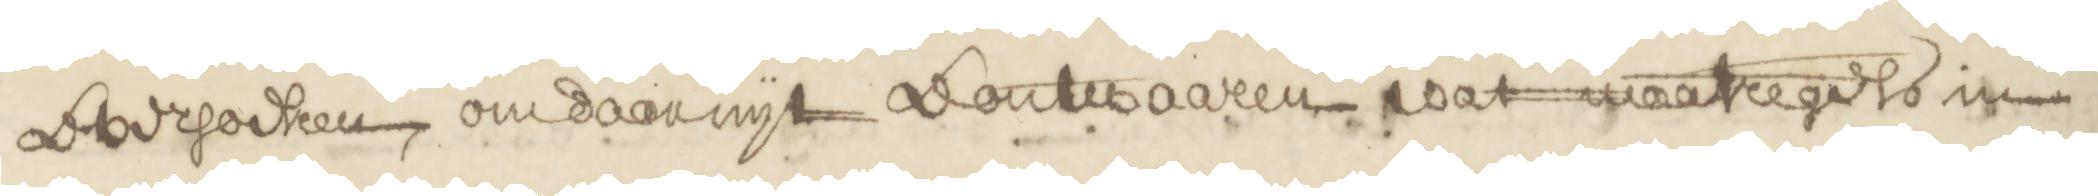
teversoeken, om daaruijt teontwaaren, wat maatregels in
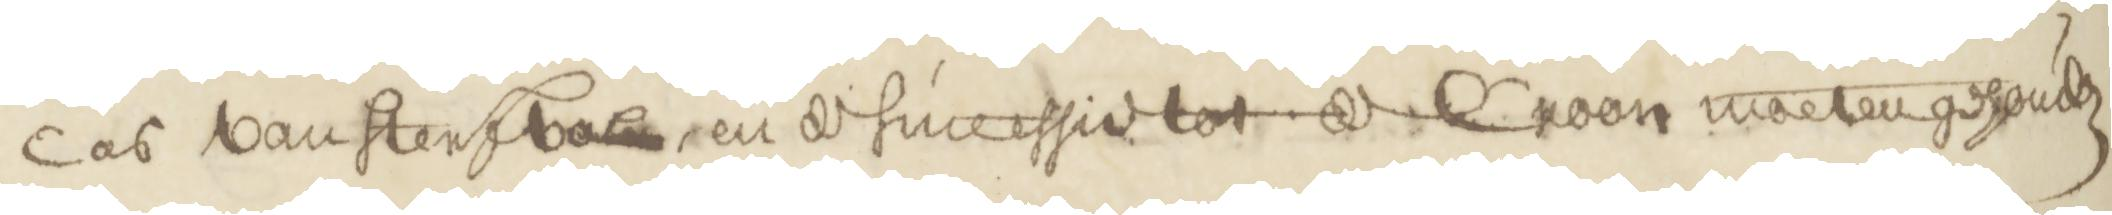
cas van sterfval, en de successie tot de Croon moeten gehouden
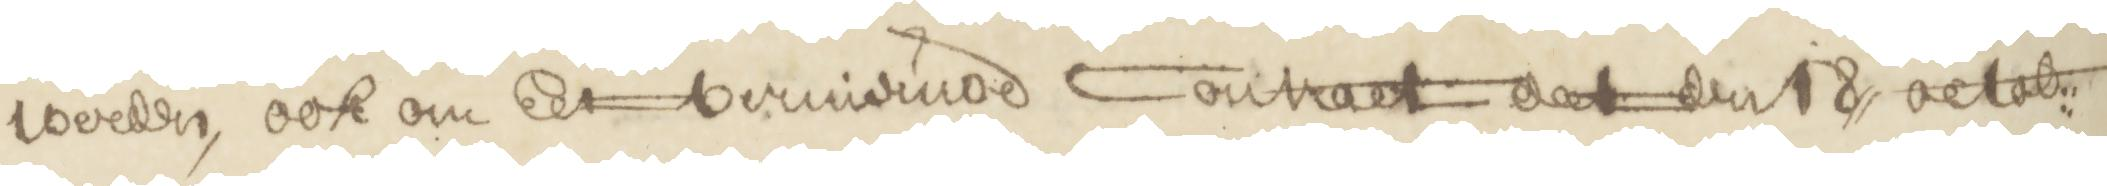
werden, ook om het vernieuwd Contract dat den 18„e octob::
